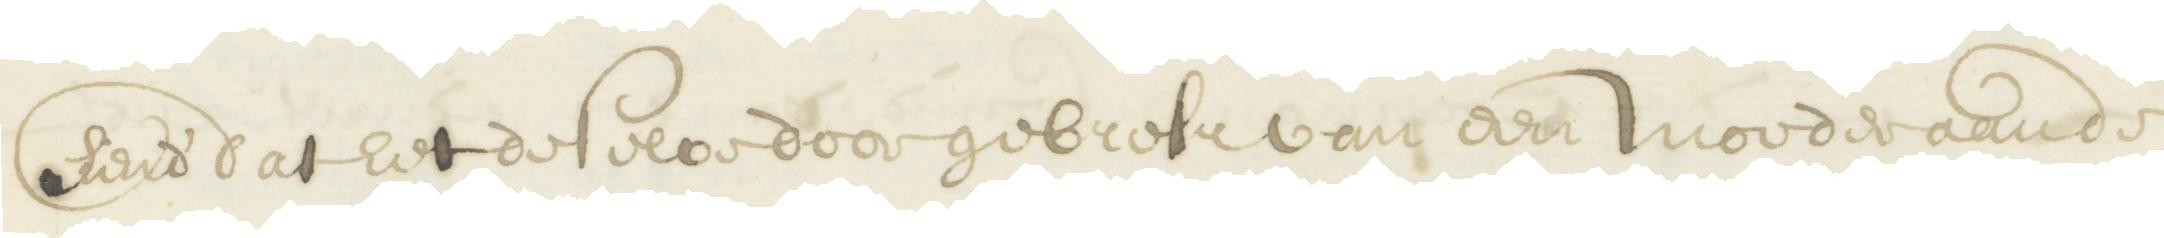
hier d' dat het deselve door gebrek van een moeder aan de
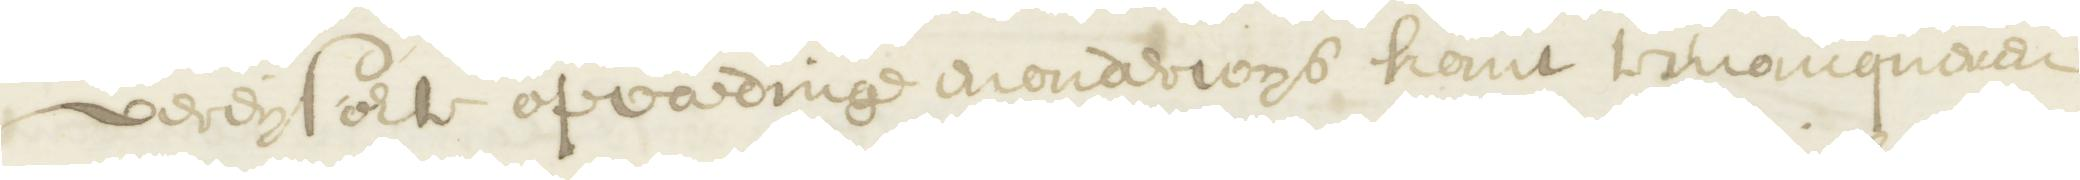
vereijschte opvoedinge en onderwys komt te manqueren
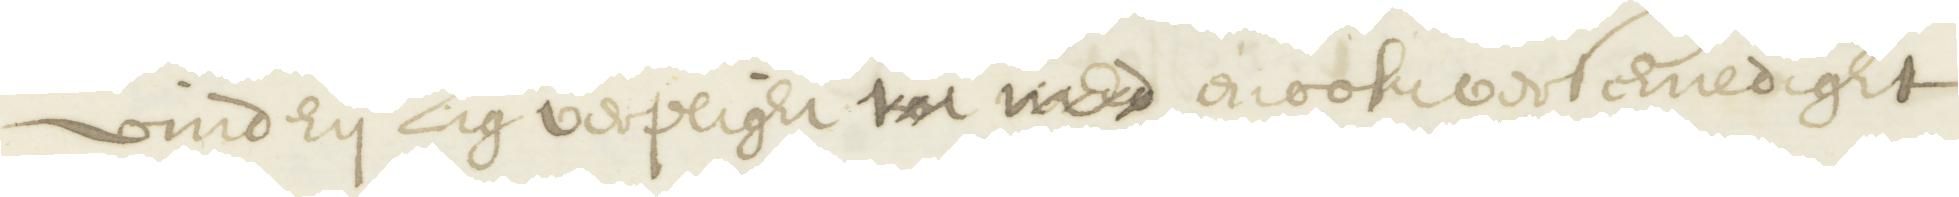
vind hij zig verplight tot werd en ook verschuldight
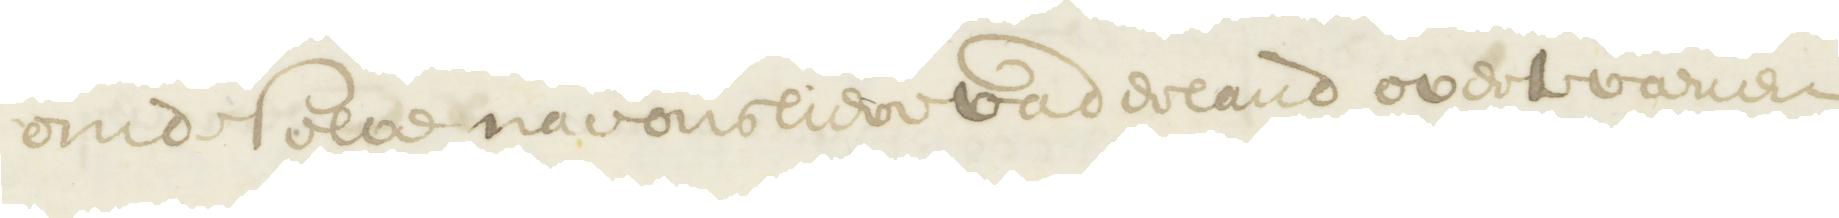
om deselve nae ons lieve vaderland over te varen
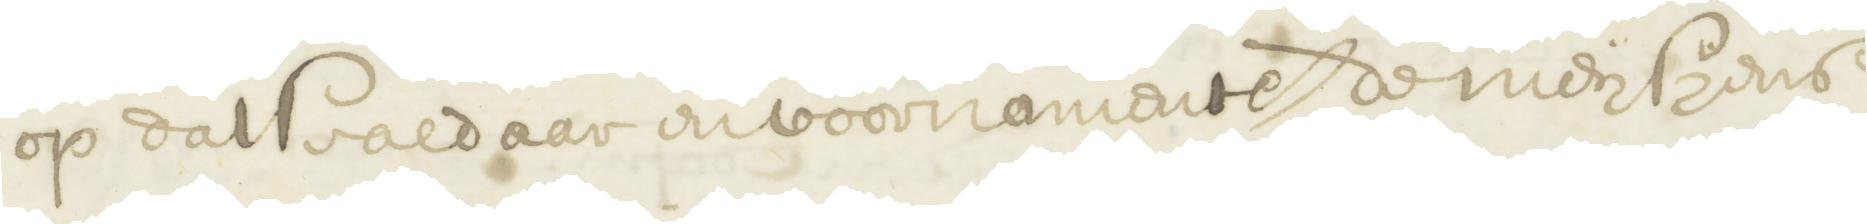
op datse aldaar en voornamentlijk de meijsjens
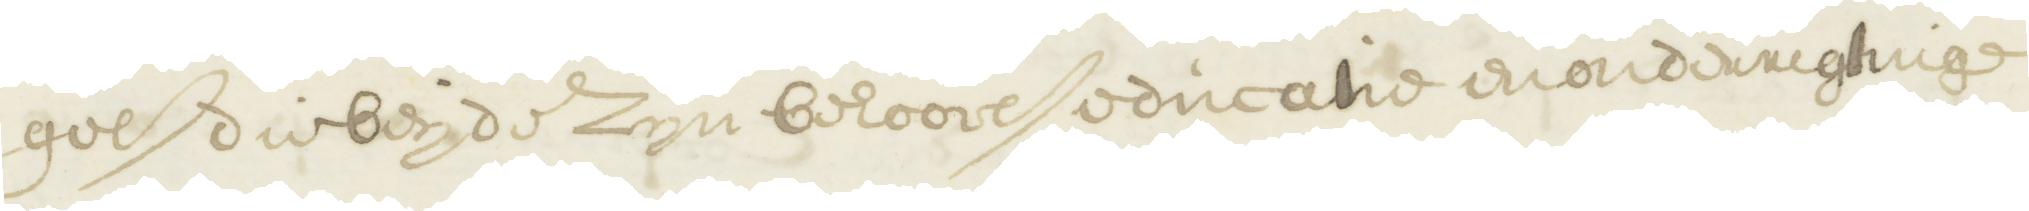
gelijk die beijde zijn behoorlijk educatie en onderrigtinge
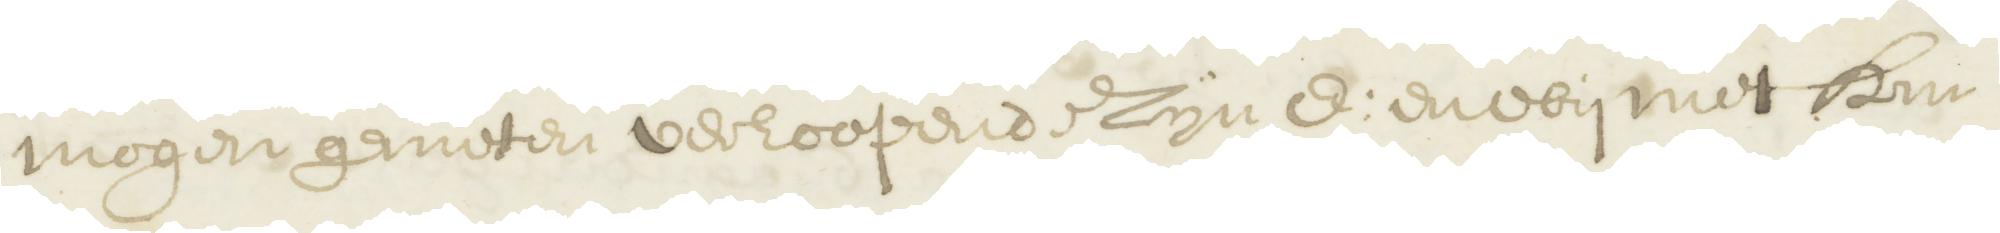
mogen genieten verhoopende zijn E: en wij met hem
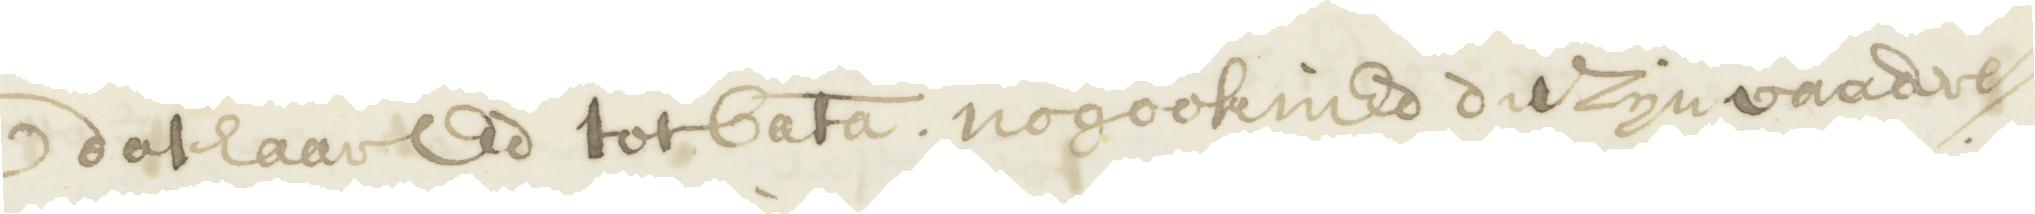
dat haar Ed tot bata. nog ook uEd dit zijn vaaderlijk
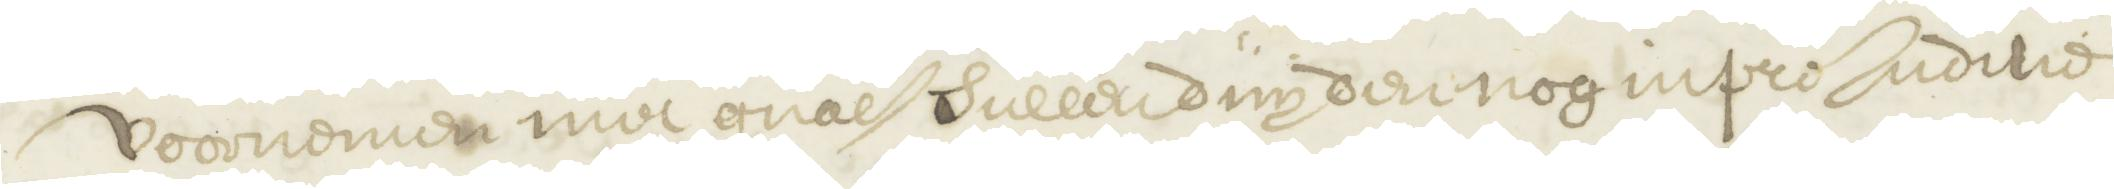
voornemen niet qualijk sullen duijden nog inproJuditie
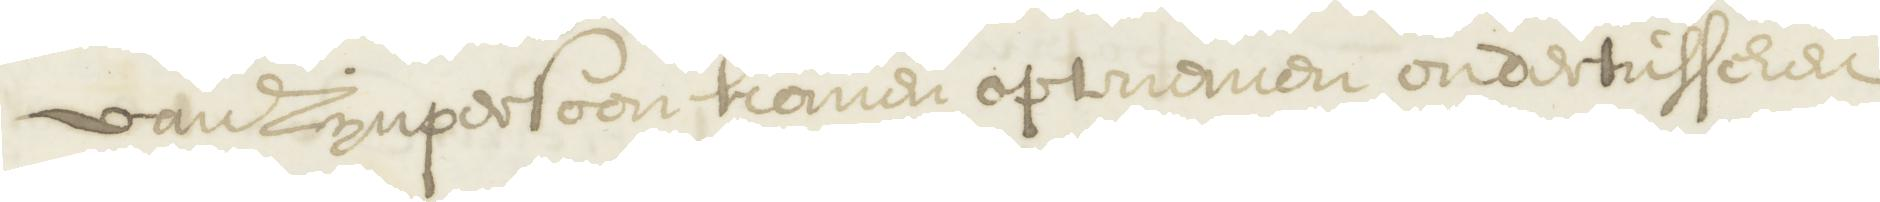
van Zijnpersoon komen op tenemen ondertusschen
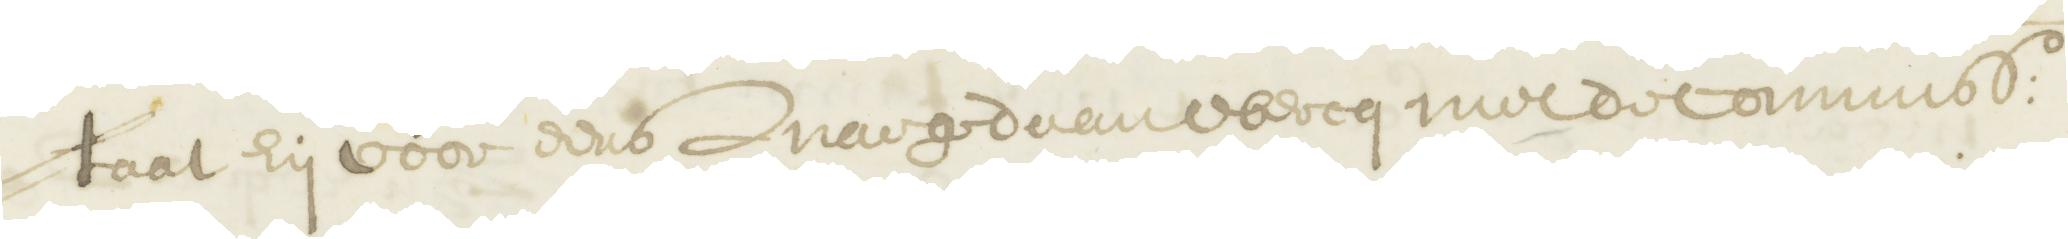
staat hij voor eerst nae gedaan wercq met de commiss:s
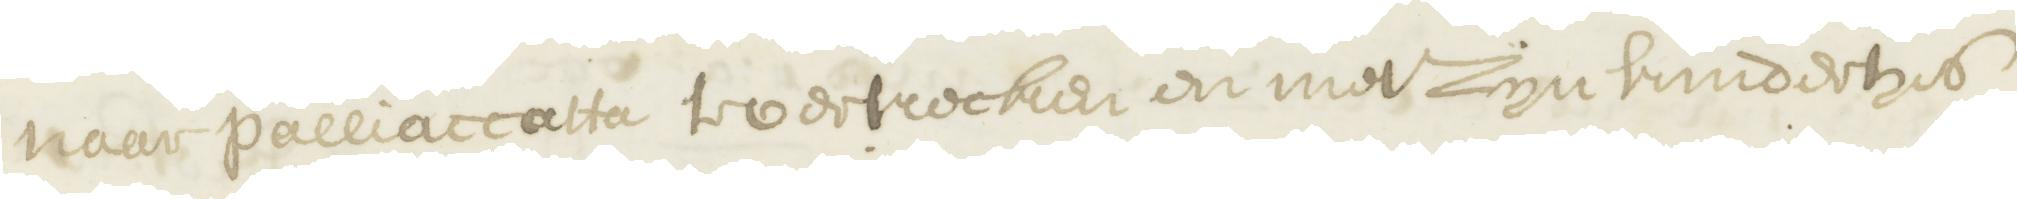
naar palliaccatta te vertrecken en met zijn kindertjes
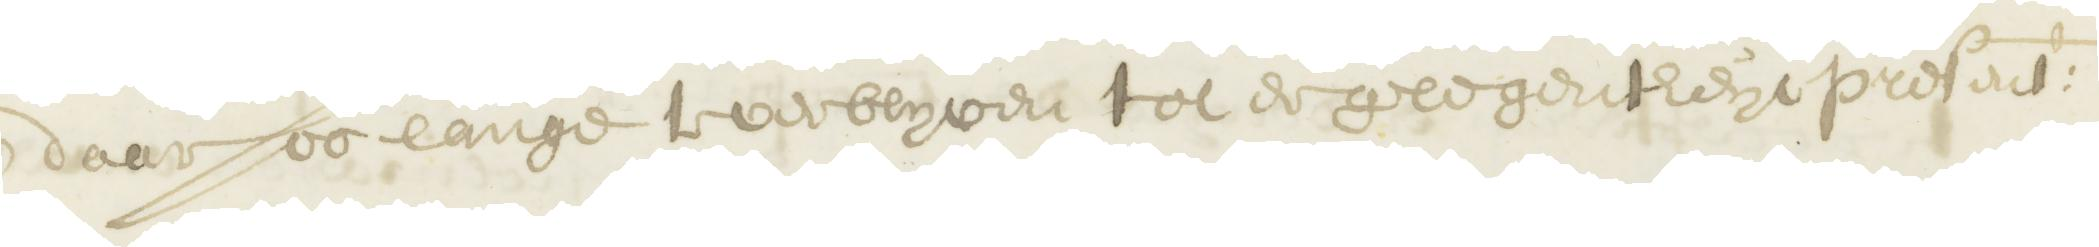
daar soo lange te verblijven tot de gelegentheijd present:
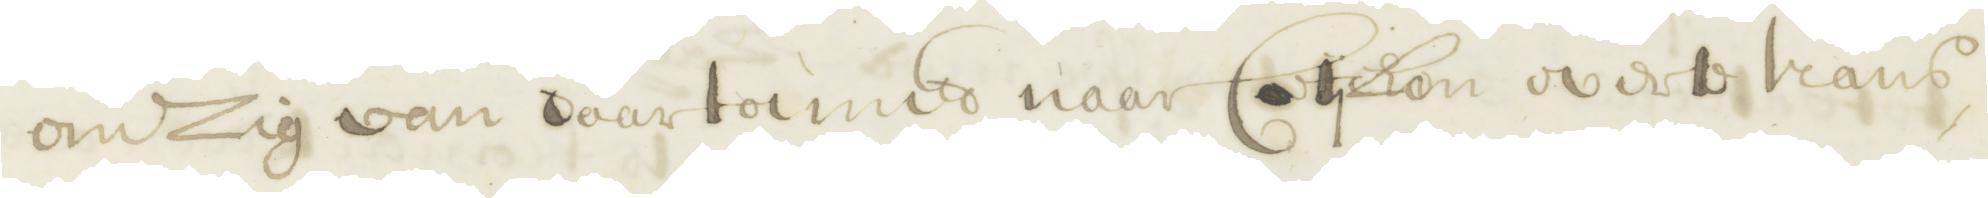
om zig van daar tot uEd naar Ceylon over te trans„
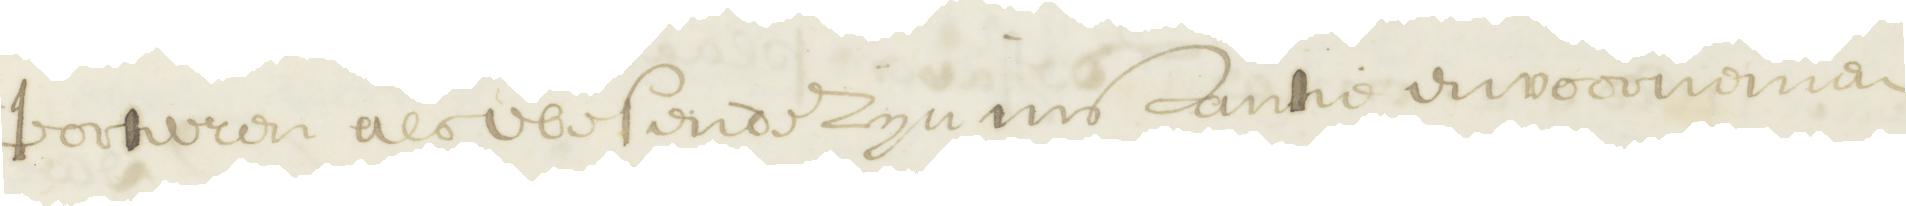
porteeren als wesende zijn instantie en voornemen
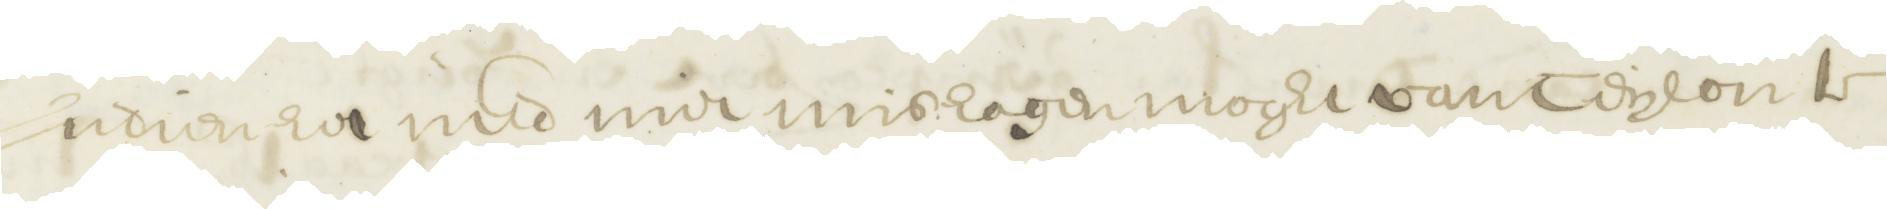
Jndien het uEd niet mishagen moght van Ceijlon te
